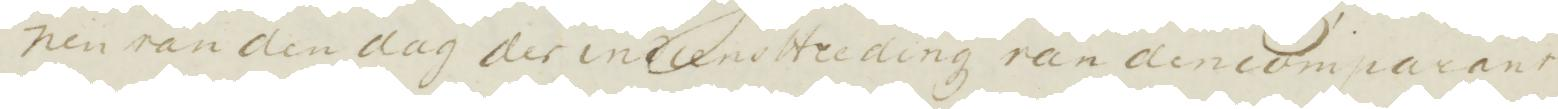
nen van den dag der indiensttreding van den comparant
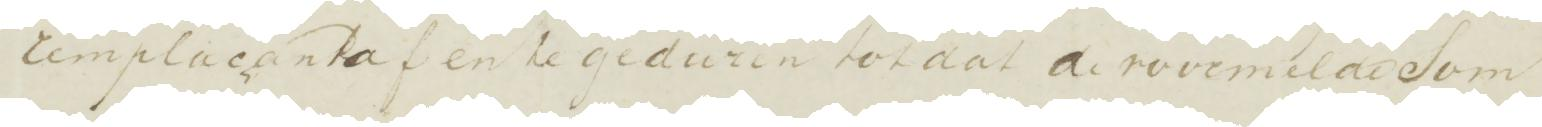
remplaçant af en te geduren tot dat de voormelde Som
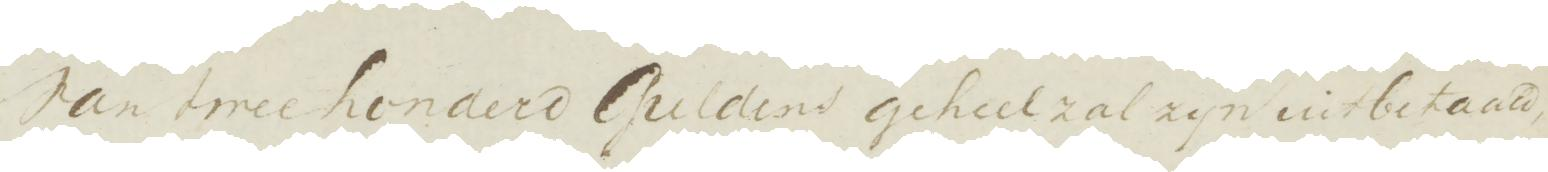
van twee honderd Guldens geheel zal zyn uitbetaald,
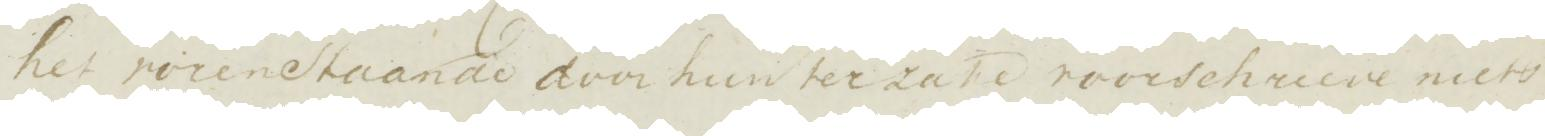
het vorenstaande door hun ter zake voorschreeve niets
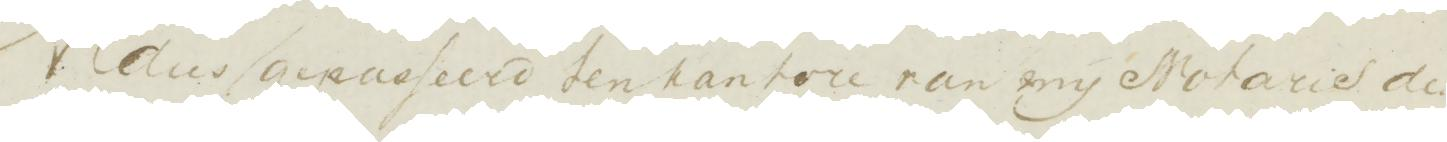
Aldus gepasseerd ten kantore van my Notaris de
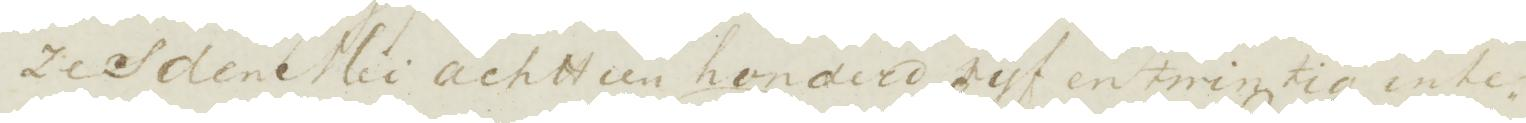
zesden Mei achttien honderd vyf en twintig in te„
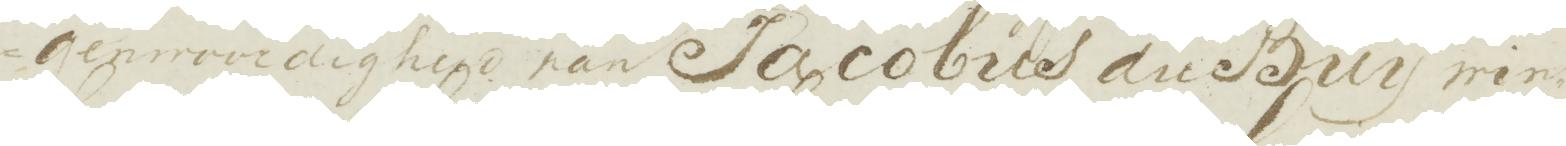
=genwoordigheid van Jacobus du Buy, win„
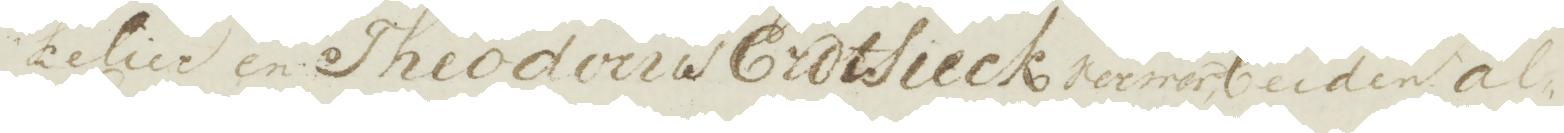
kelier en Theodous Erdtsieck verwer, beiden al„
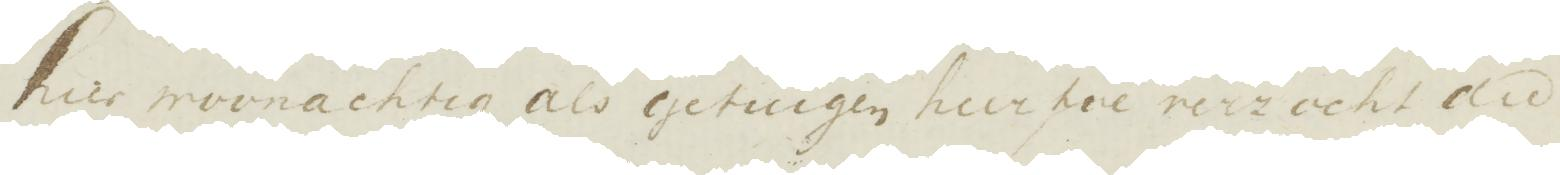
hier woonachtig als getuigen hier toe verzocht die
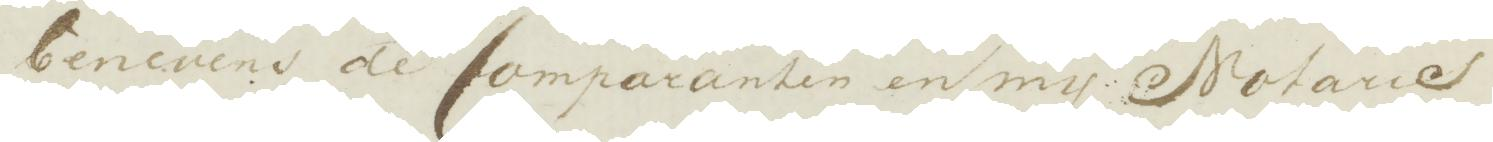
benevens de Comparanten en my Notaris
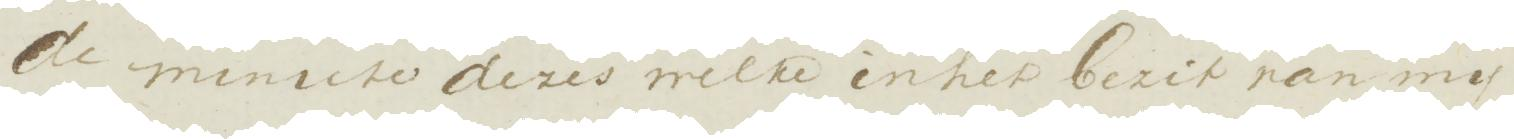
de minute dezes welke in het bezit van my
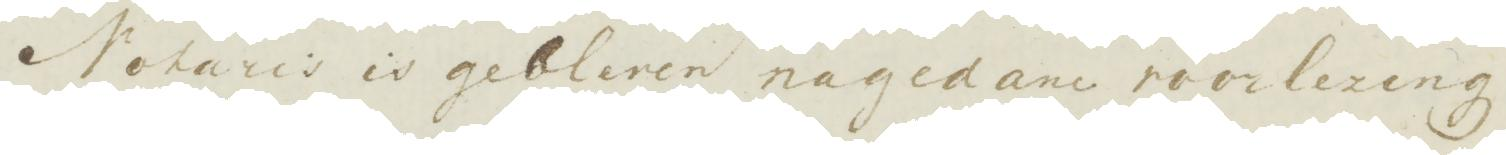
Notaris is gebleven nagedane voorlezing
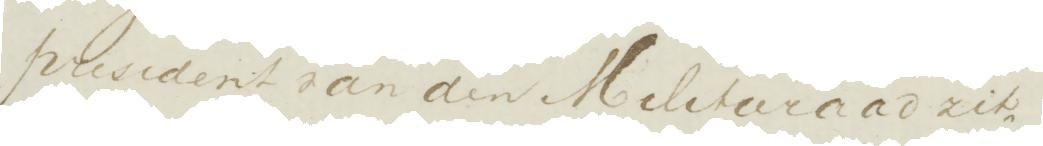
president van den Militieraad zit„
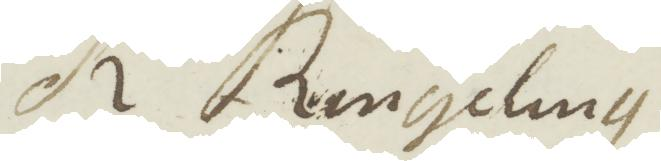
K Ringeling
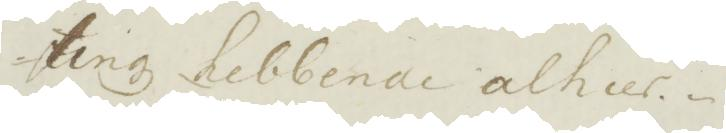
=ting hebbende alhier.
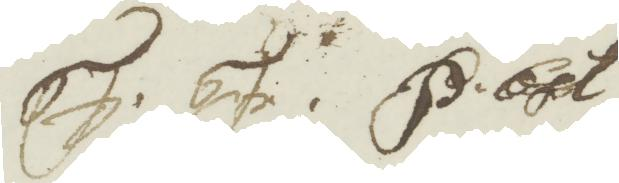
F: F: Post
